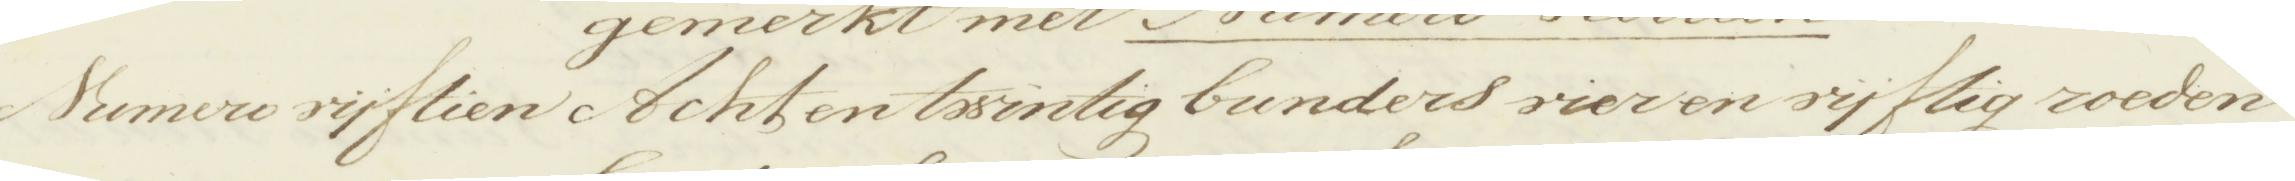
Numero vijftien Acht en twintig bunders vier en vijftig roeden
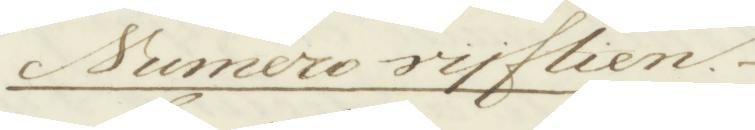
Numero vijftien.
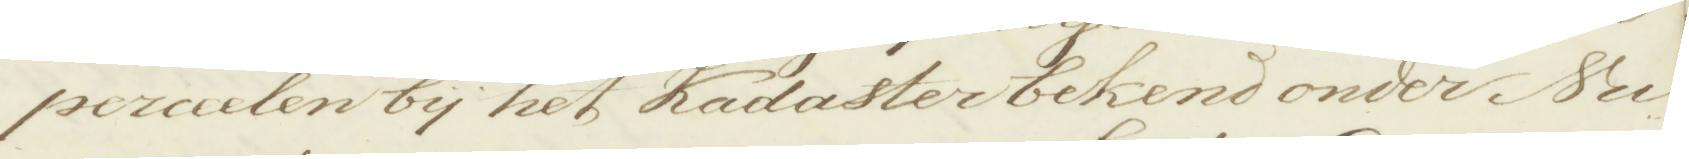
perceelen bij het Kadaster bekend onder Nu„
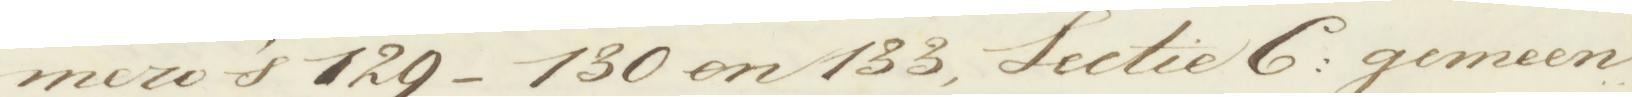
mero's 129 - 130 en 133, Sectie C: gemeen.
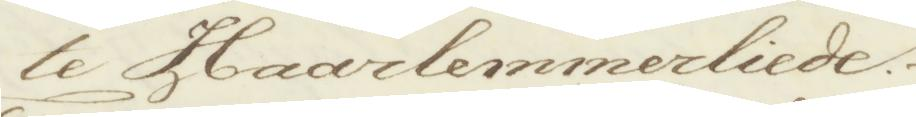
te Haarlemmerliede.
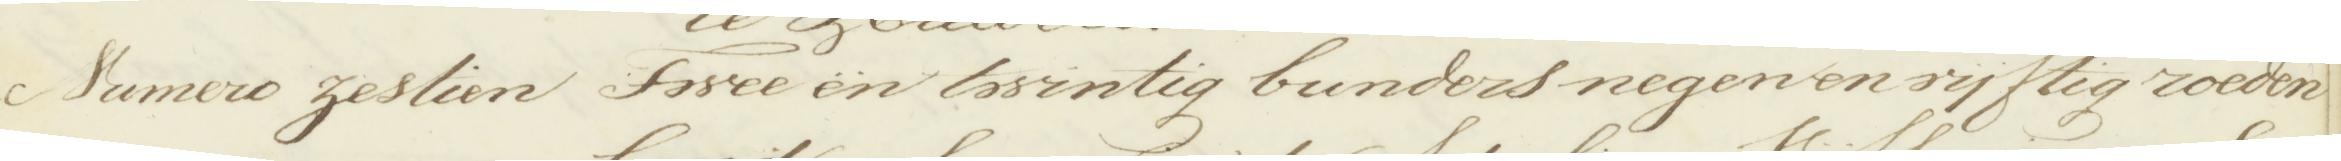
Numero zestien Twee ën twintig bunders negen en vijftig roeden
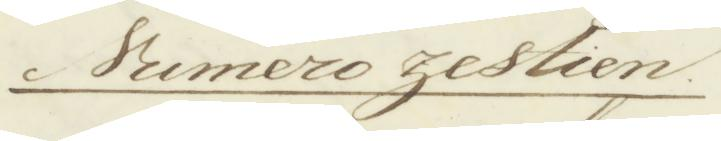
Numero zestien.
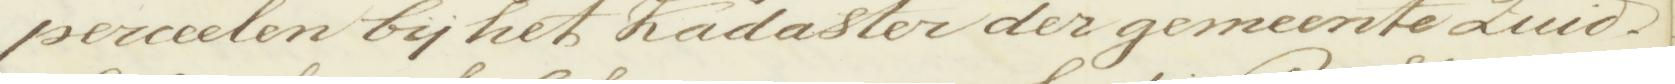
perceelen bij het Kadaster der gemeente Zuid-
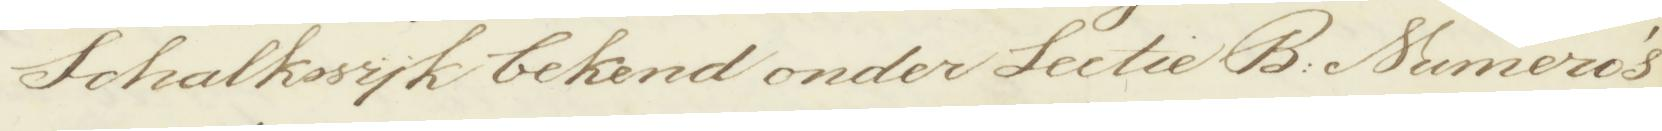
Schalkwijk bekend onder Sectie B: Numero's
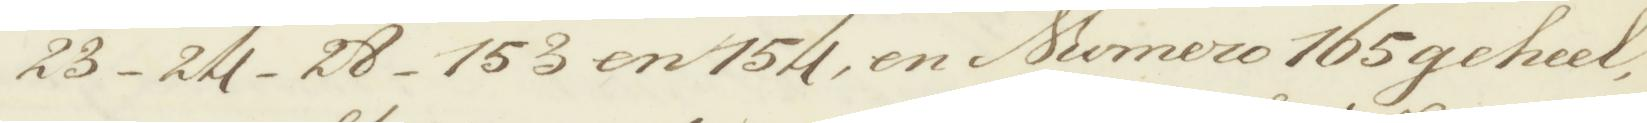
23 - 24 - 28 - 53 en 154, en Numero 165 geheel,
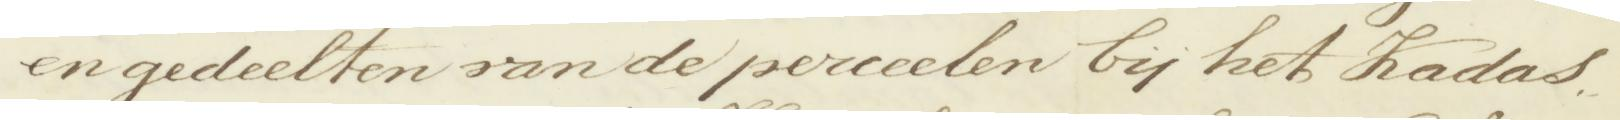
en gedeelten van de perceelen bij het Kadas„
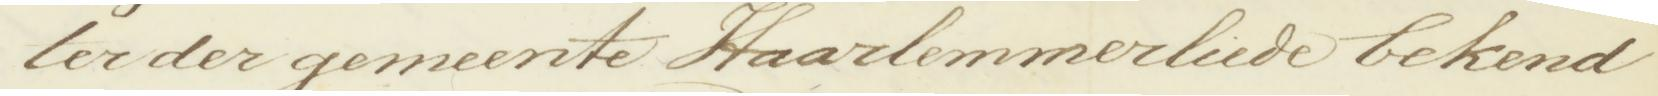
ter der gemeente Haarlemmerliede bekend
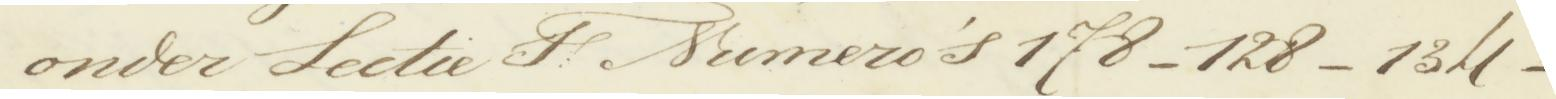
onder Sectie F: Numero's 178 - 128 - 134 -
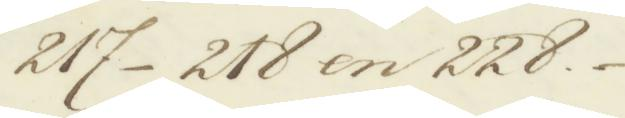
217 - 218 en 228. —
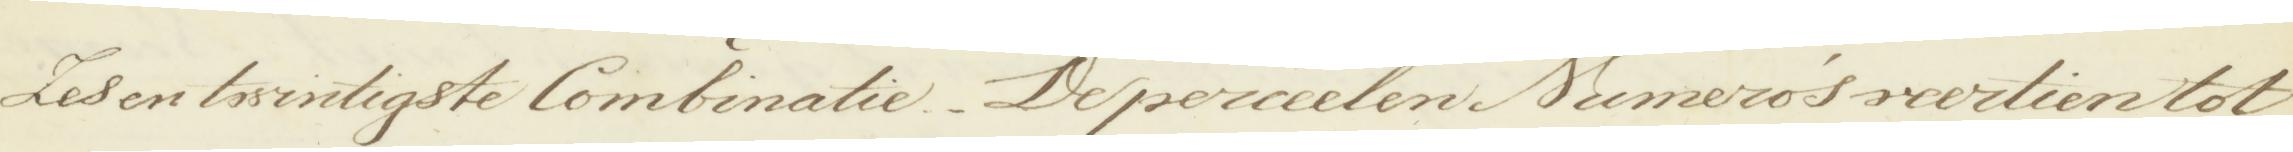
Zes en twintigste Combinatie. - De perceelen Numero's veertien tot
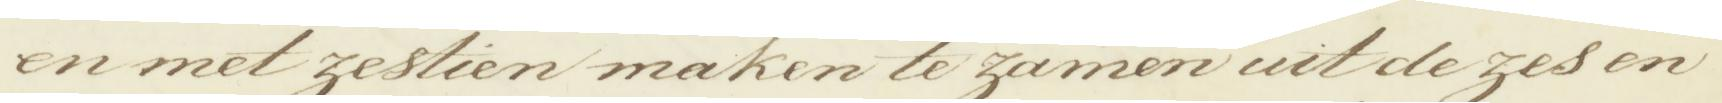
en met zestien maken te zamen uit de zes en
